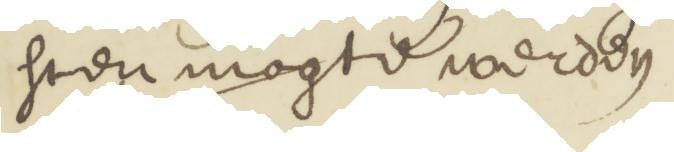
sten mogte werden
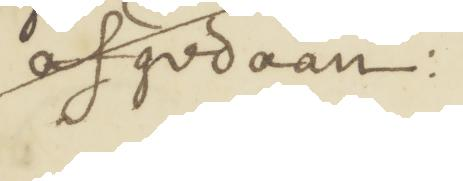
afgedaan:
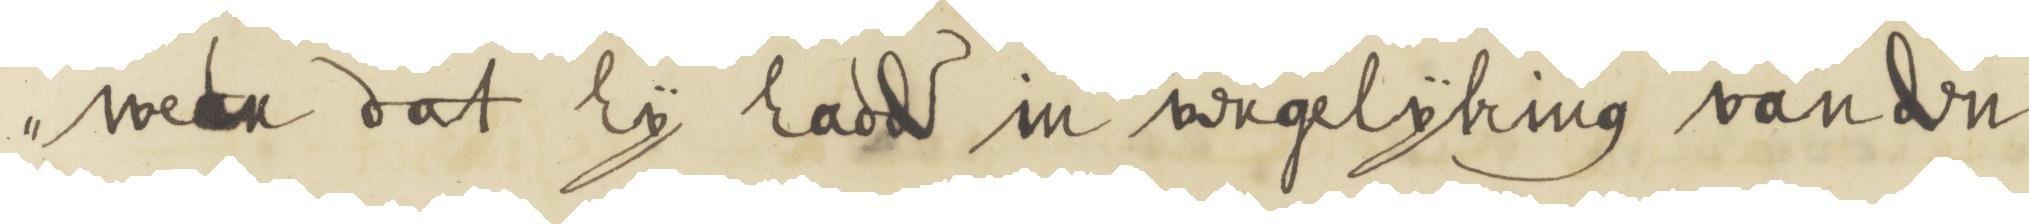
„weer dat hij hadde in vergelijking van den
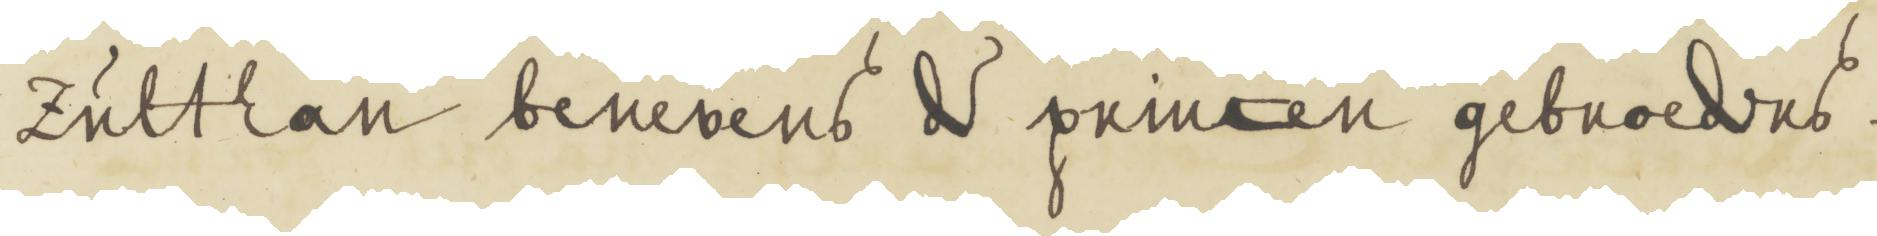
zulthan benevens de princen gebroeders
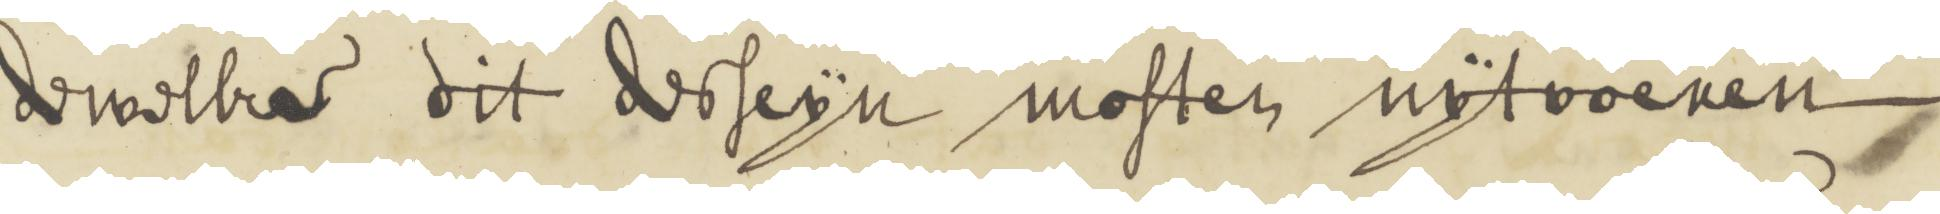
dewelke dit desseijn mosten uijtvoeren
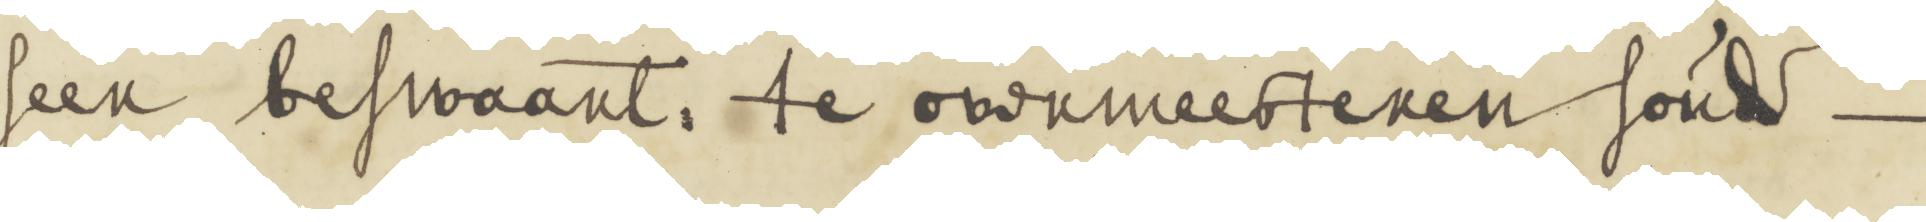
seer beswaarl: te overmeesteren soude —
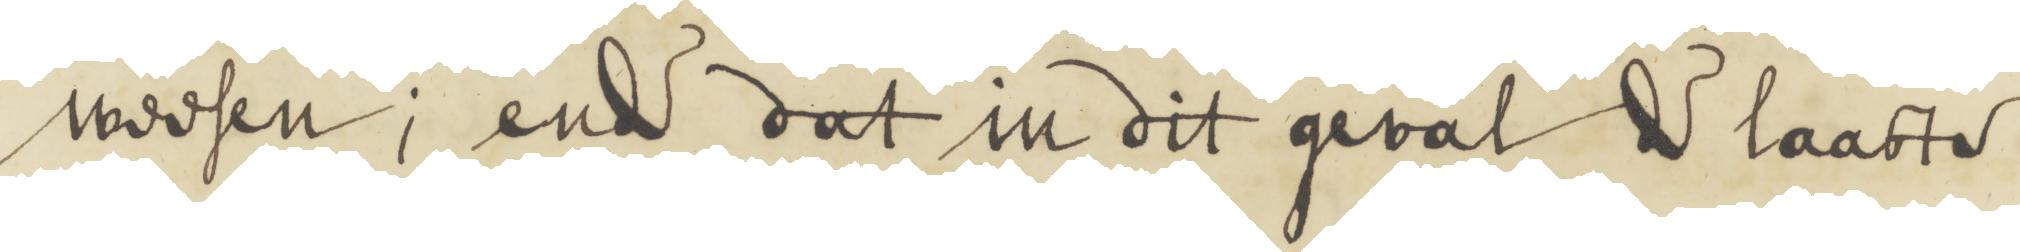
weesen; ende dat in dit geval de laaste
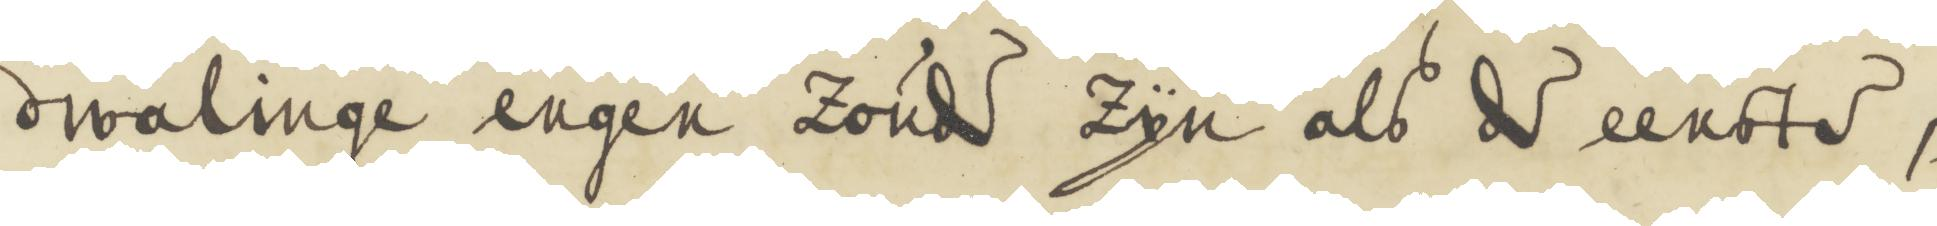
dwalinge erger zoude zijn als de eerste
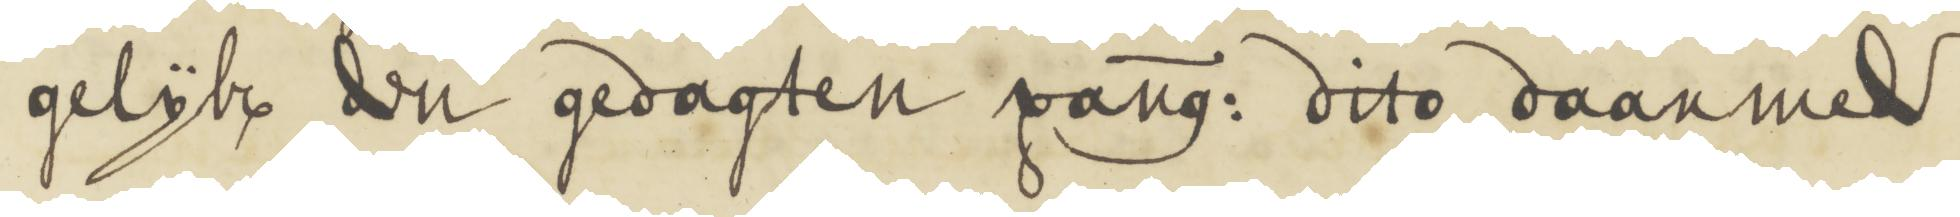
gelijk den gedagten pang: dito daarmede
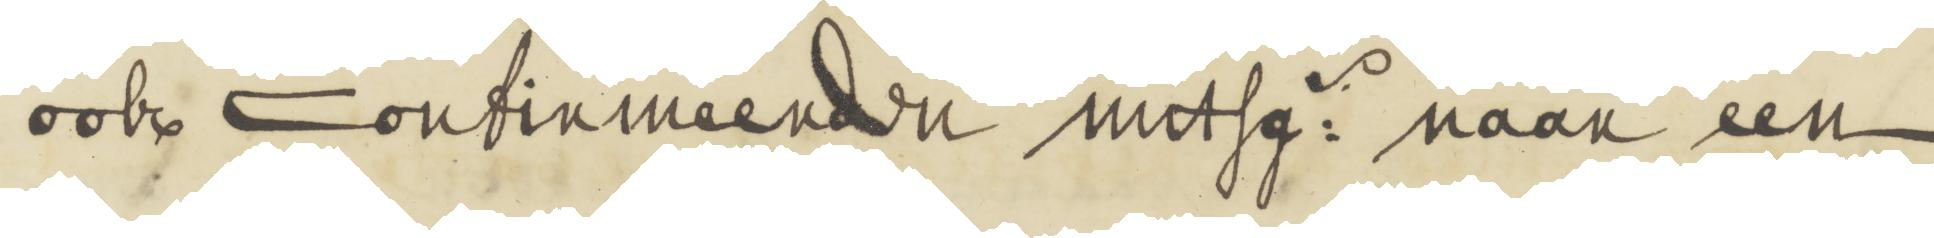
ook confirmeerden mitsg:s naar een
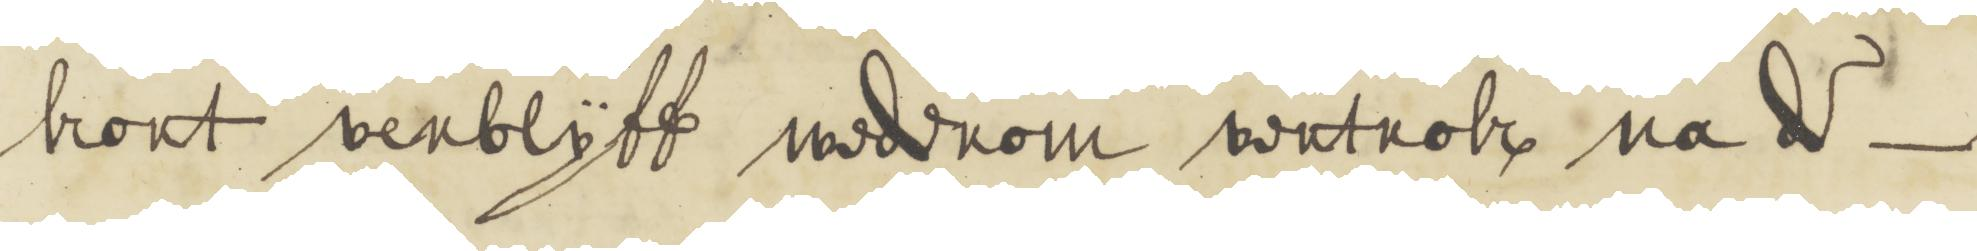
kort verblijff wederom vertrok na de —
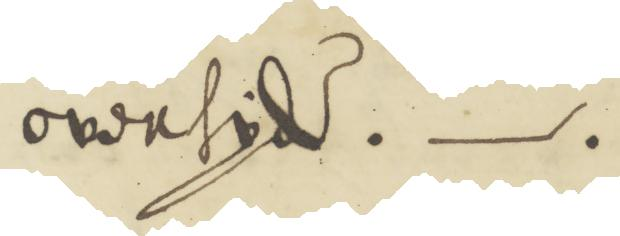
oversijde. — .
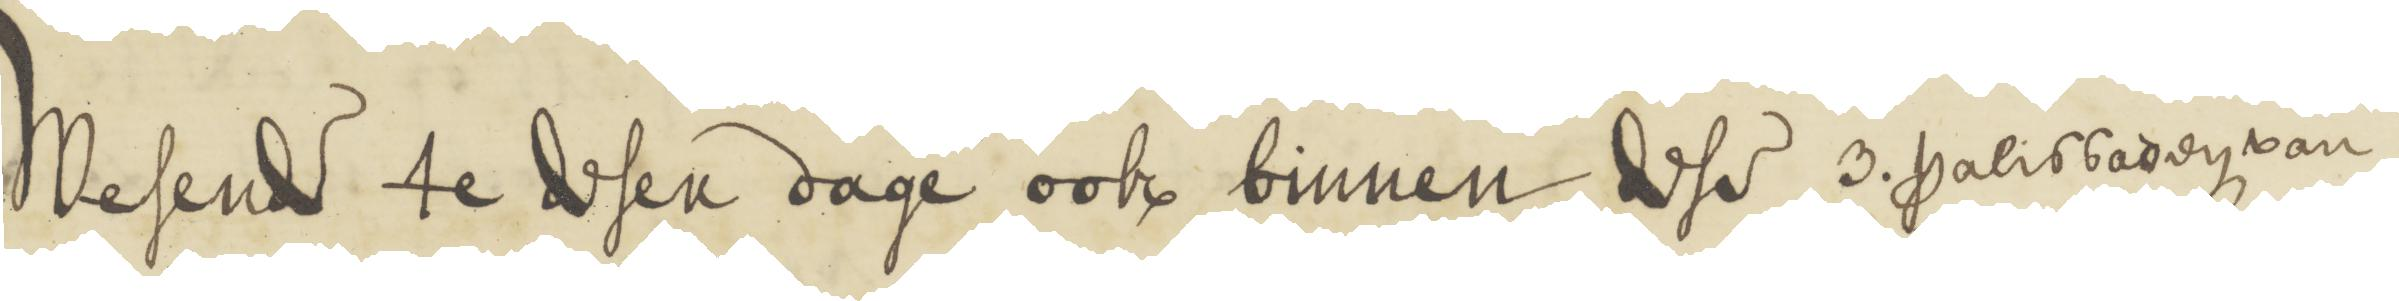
Wesende te deser dage ook binnen dese 3. palissaden van
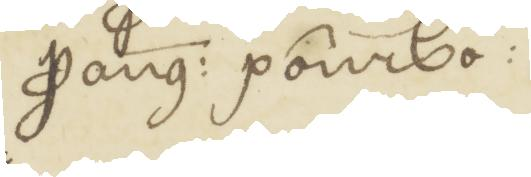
pang: pourbo:
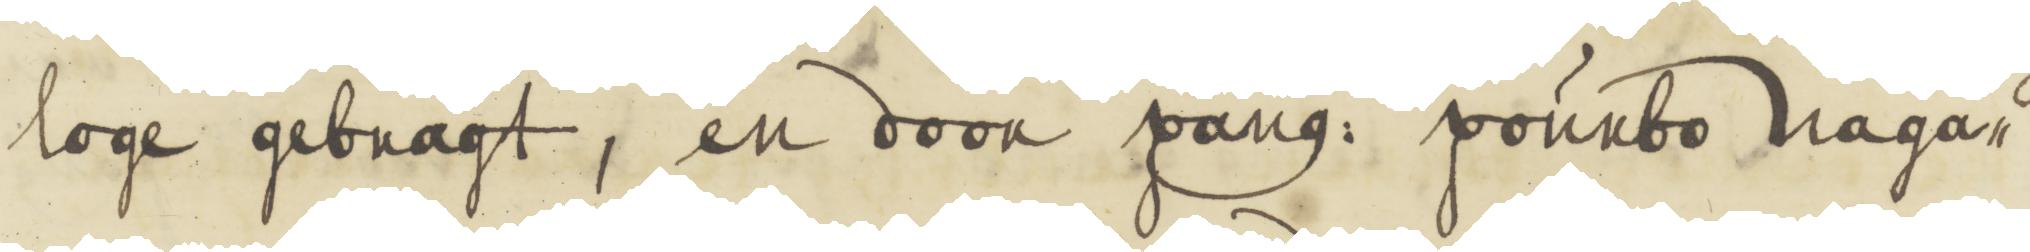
loge gebragt, en door pang: pourbo naga„
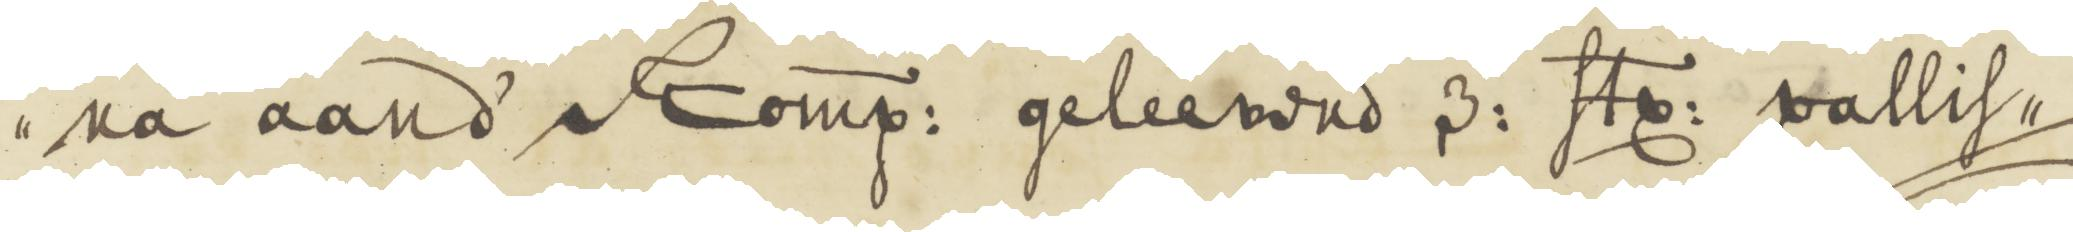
„ra aan d’ EComp: geleeverd 3: stx: pallis„
